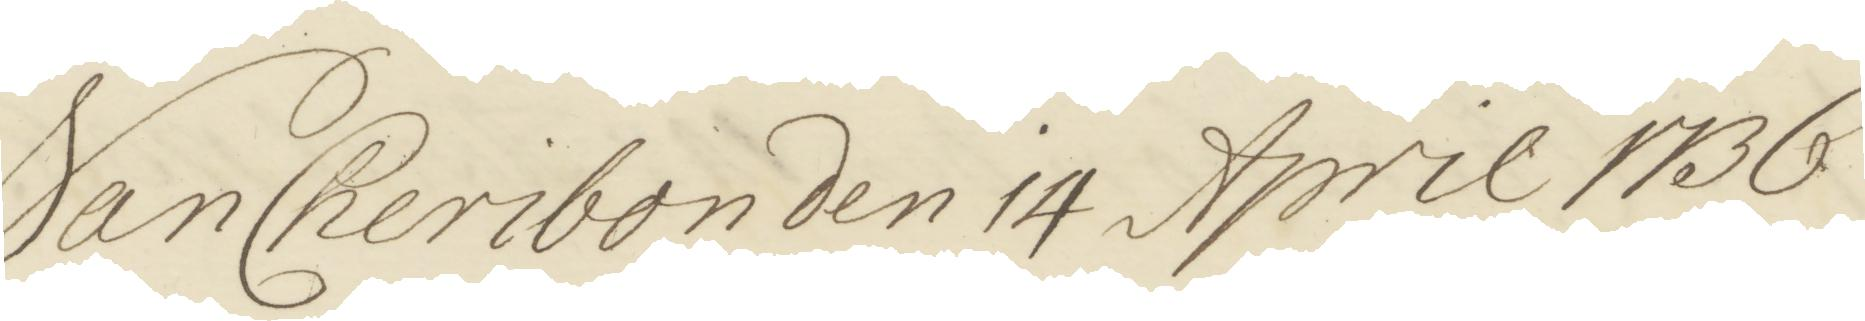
Van Cheribon den 14 April 1736
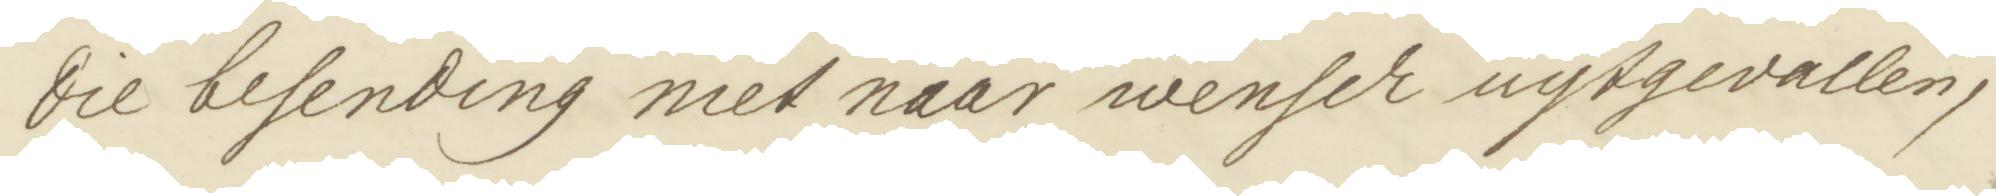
die besending niet naar wensch uijtgevallen,
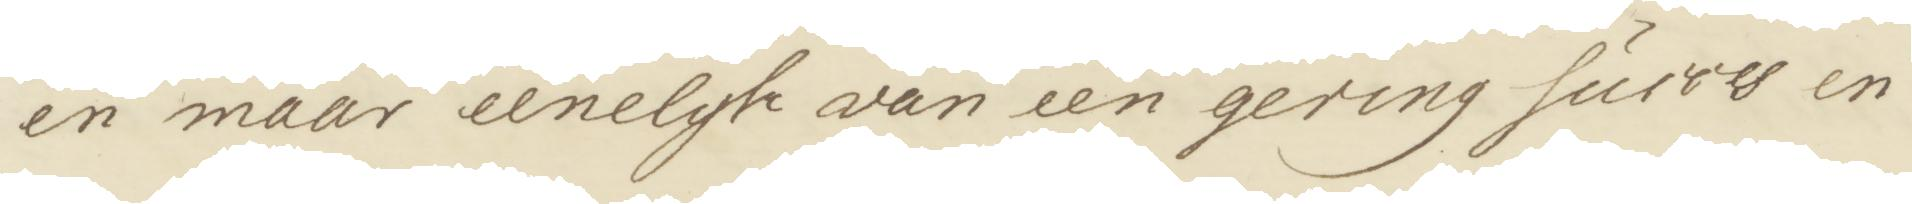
en maar eenelijk van een gering succes en
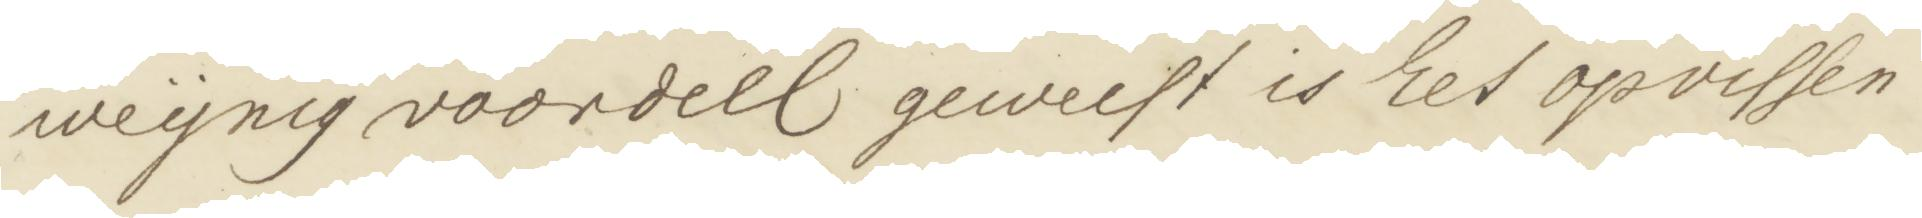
weijnig voordeel geweest is het opvissen
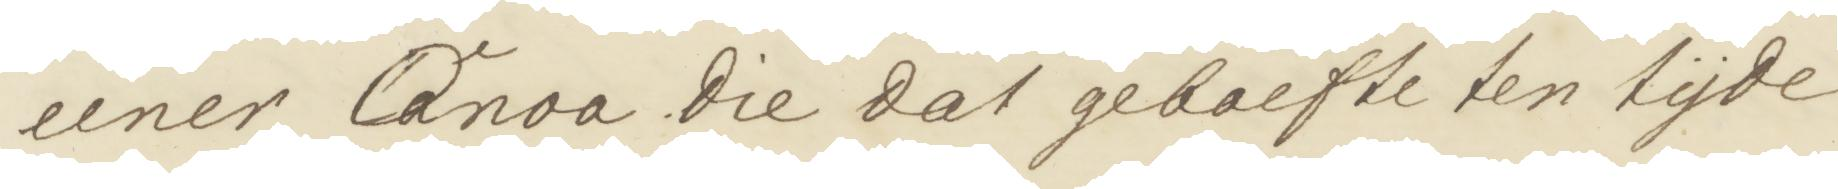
eener Canoa die dat geboefte ten tijde
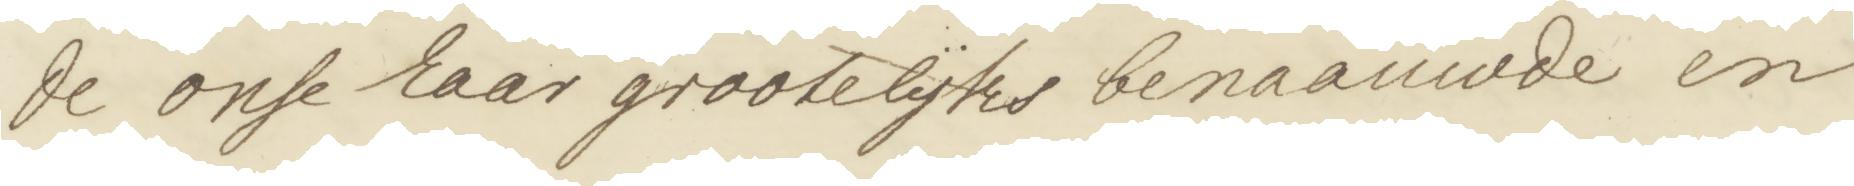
de onse haar grootelijks benaauwde en
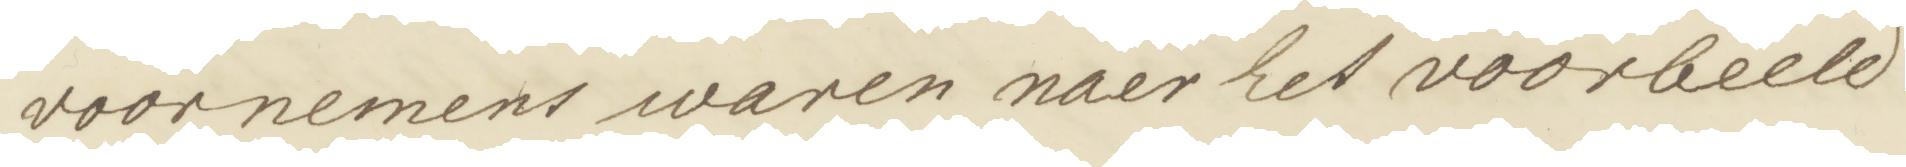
voornemens waren naer het voorbeeld
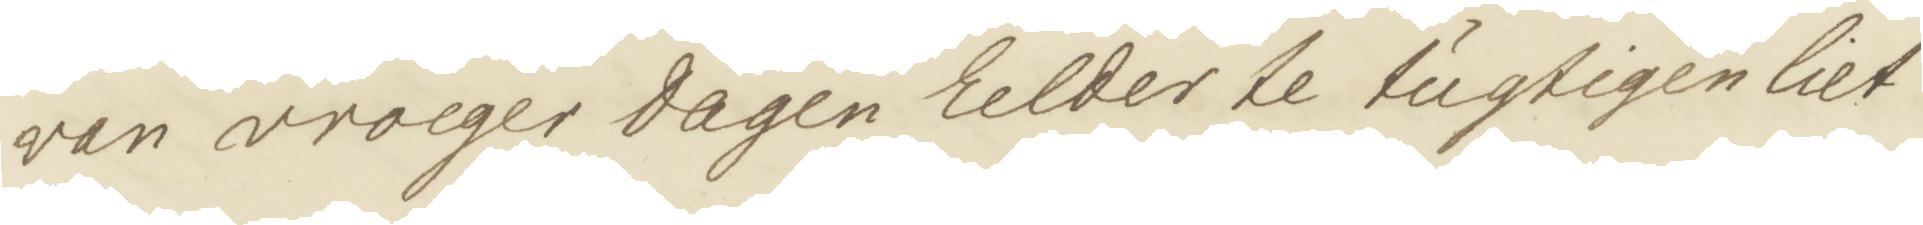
van vroeger dagen helder te tugtigen liet
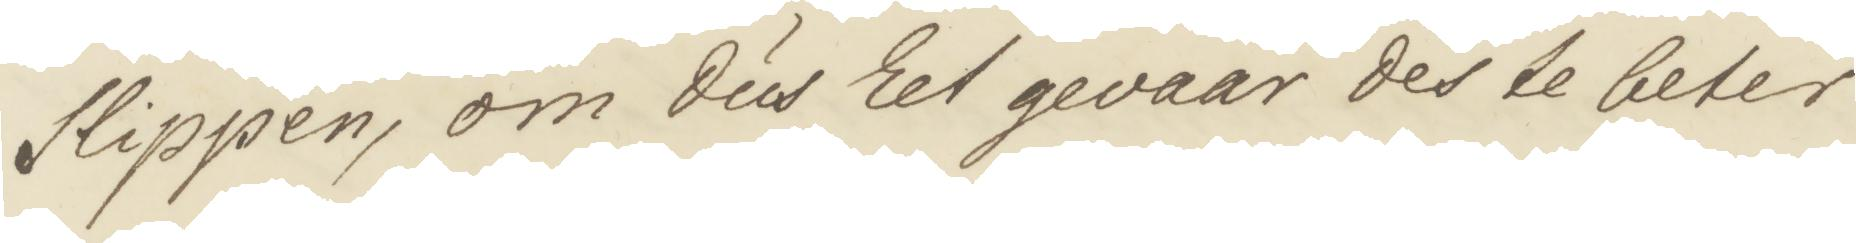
slippen, om dus het gevaar des te beter
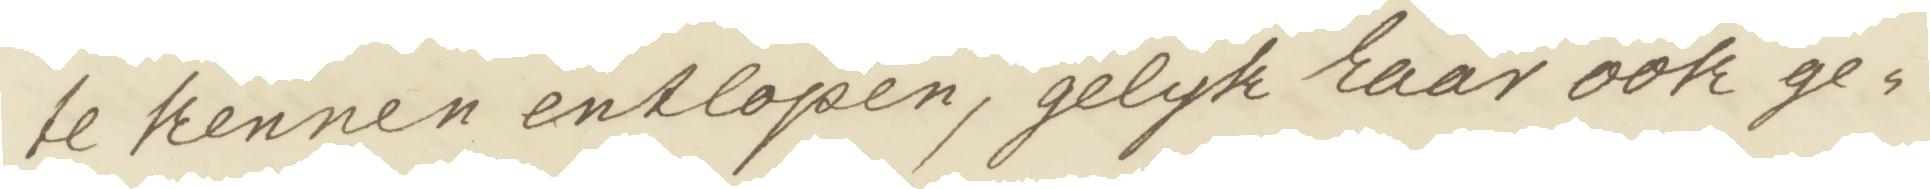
te kennen en t lopen, gelijk haar ook ge„
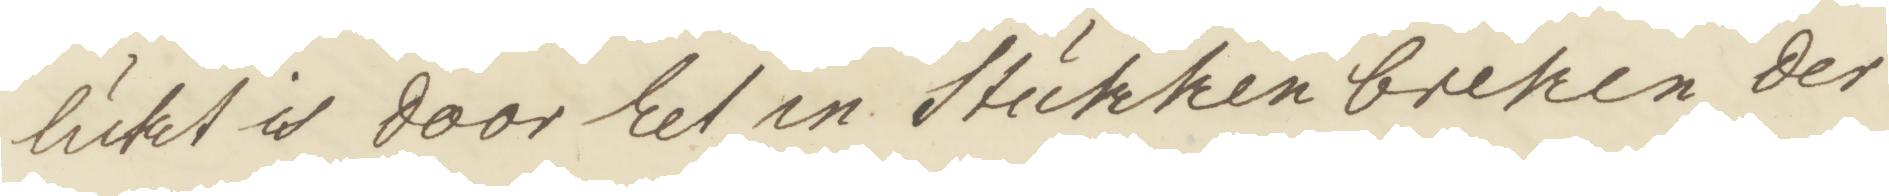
lukt is door het in stukken breken der
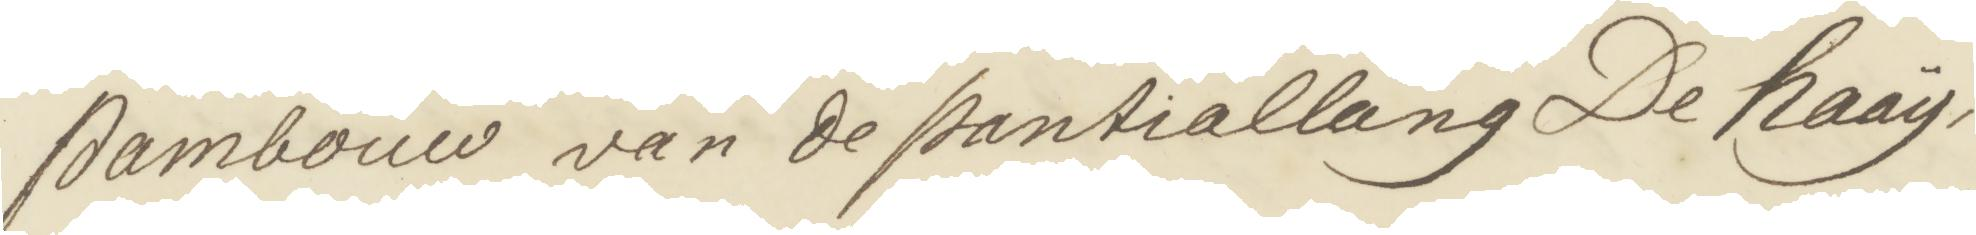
Pambouw van de pantiallang De Haaij,
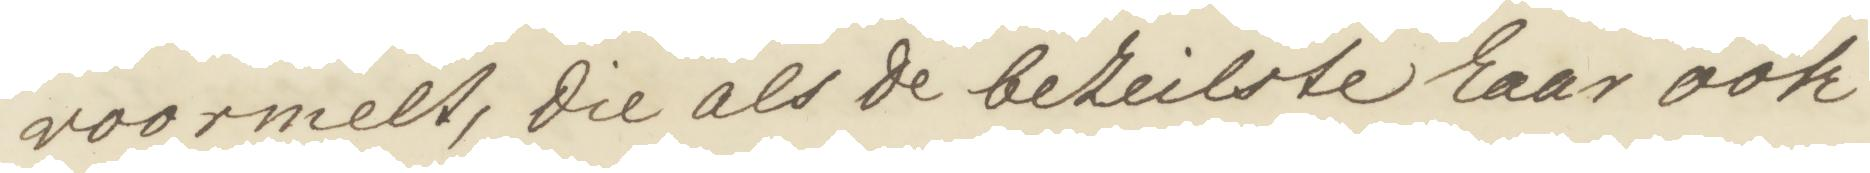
voormelt, die als de bezeilste haar ook
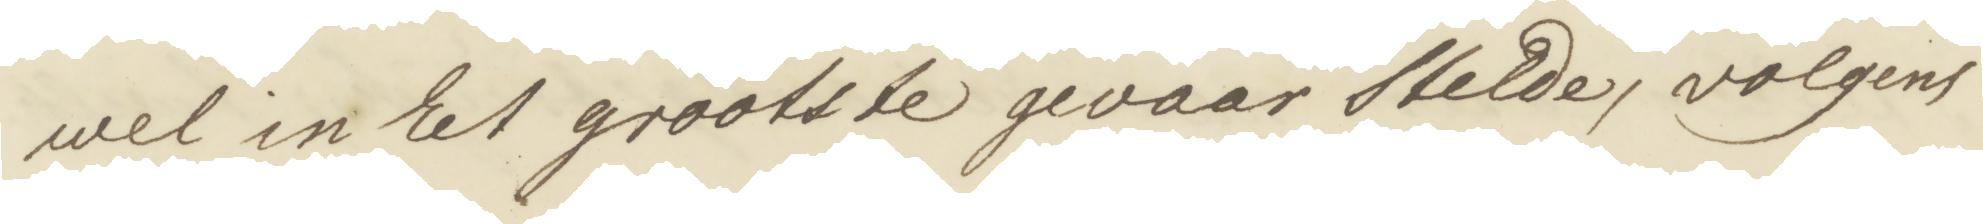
wel in het grootste gevaar stelde, volgens
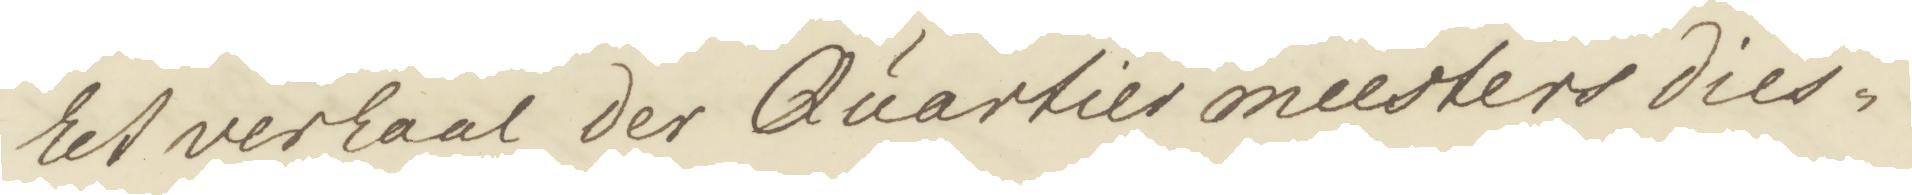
het verhaal der Quartier meesters dies„
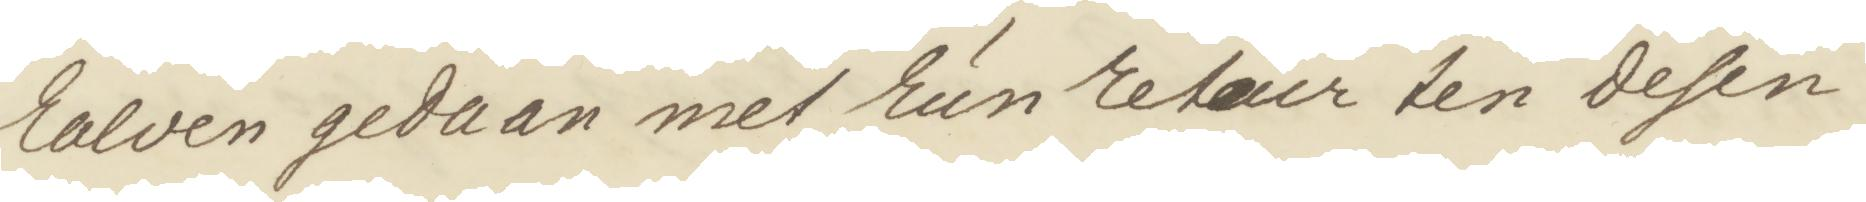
halven gedaan met hun retour ten desen
